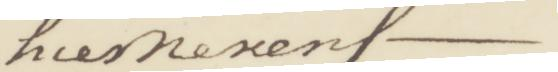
hiernevens. —
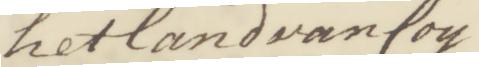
het land van Coy
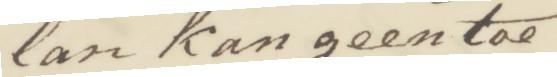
lan kan geen toe
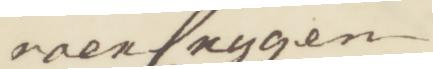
voer Crygen
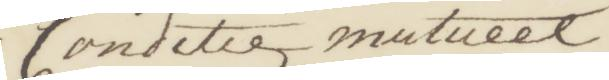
Conditie mutueel
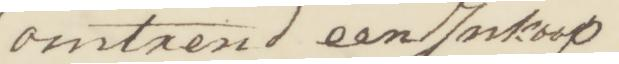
omtrend een Jnkoop
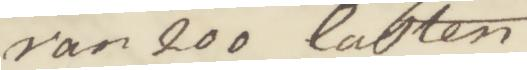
van 200 lasten
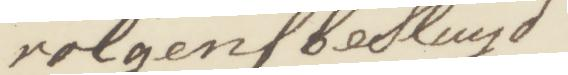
volgens besluyd
